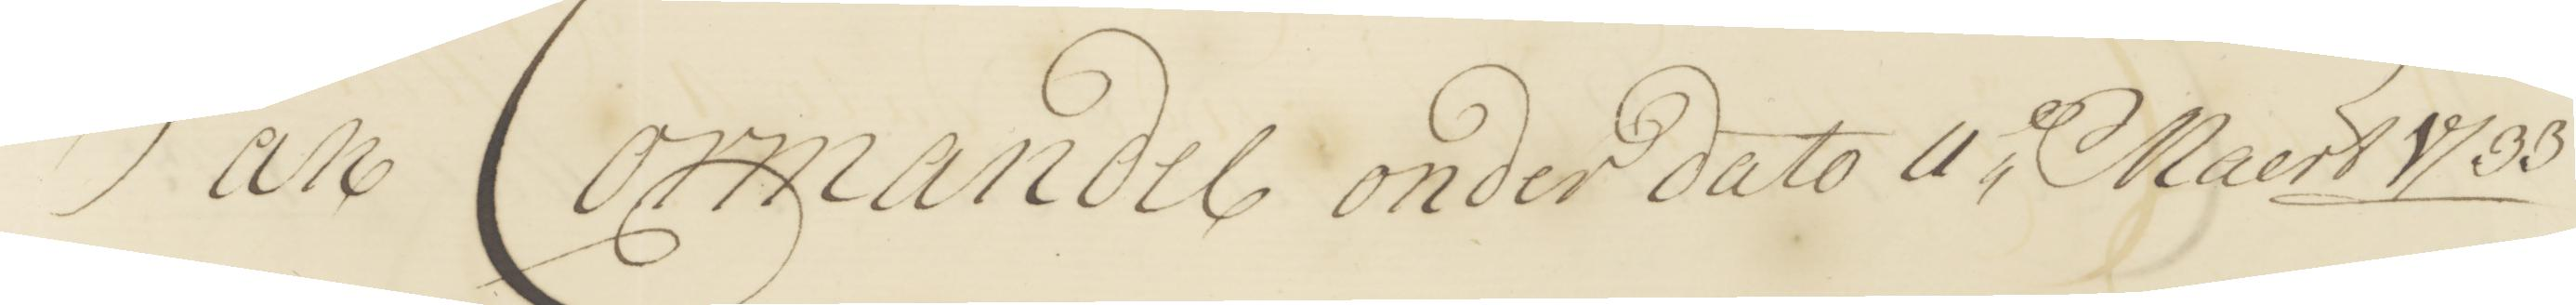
Van Cormandel onder dato 4„e Maert 1733
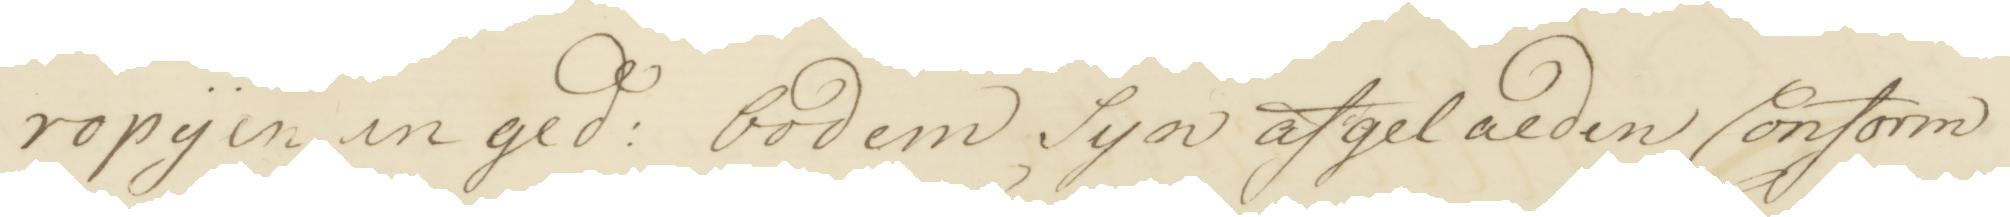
ropijen in ged: bodem syn afgelaeden Conform
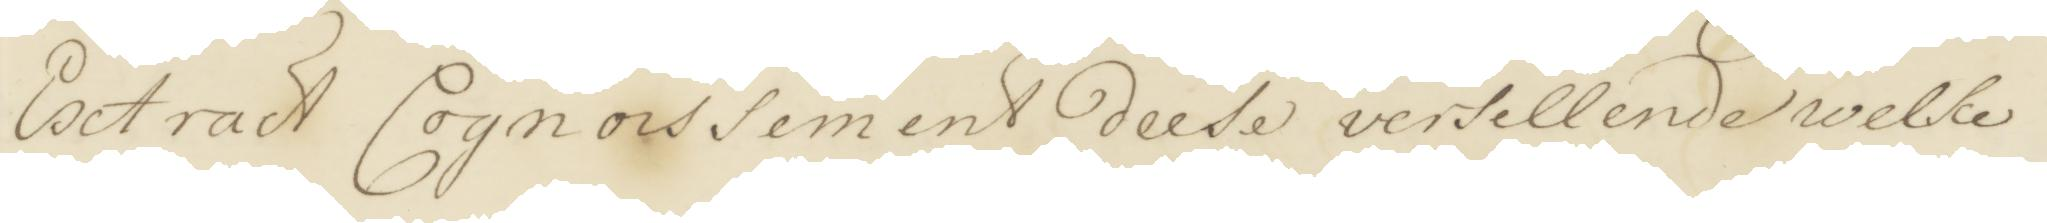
Extract Cognoissement deese versellende welke
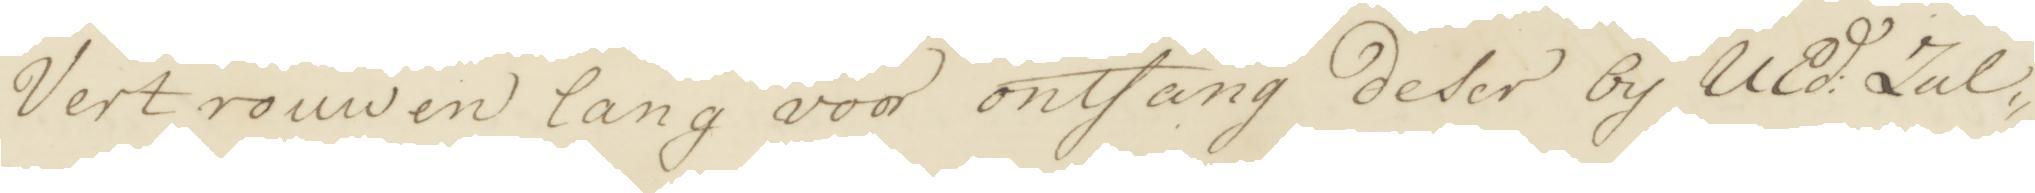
Vertrouwen lang voor ontfang deser by UEd: zul„
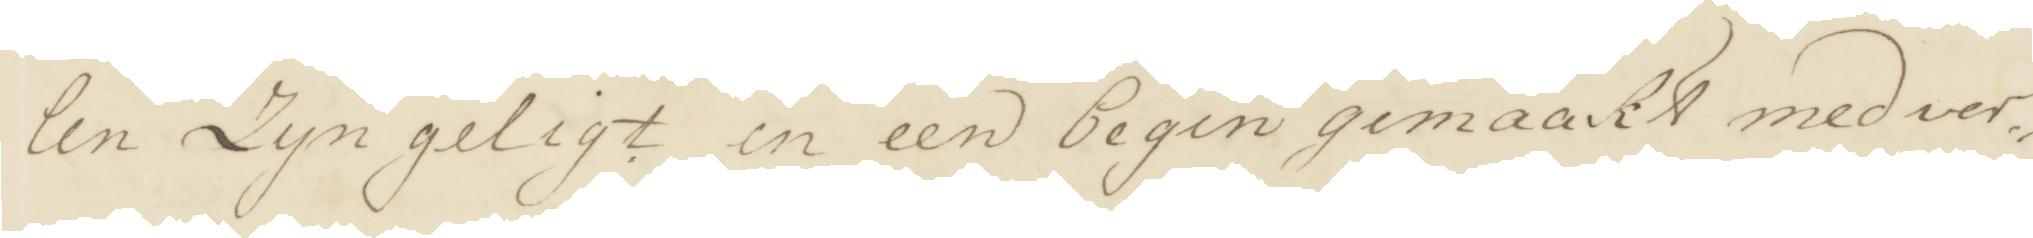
len zyn geligt en een begin gemaakt med ver„
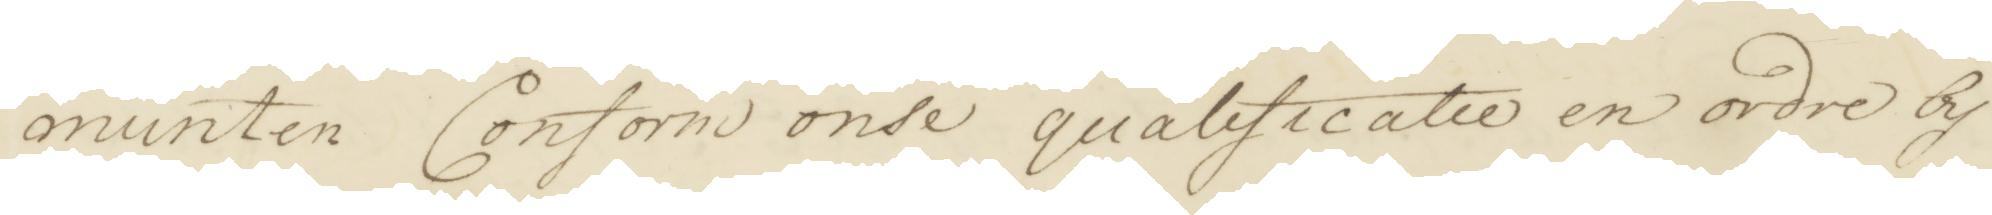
munten Conform onse qualificatie en ordre by
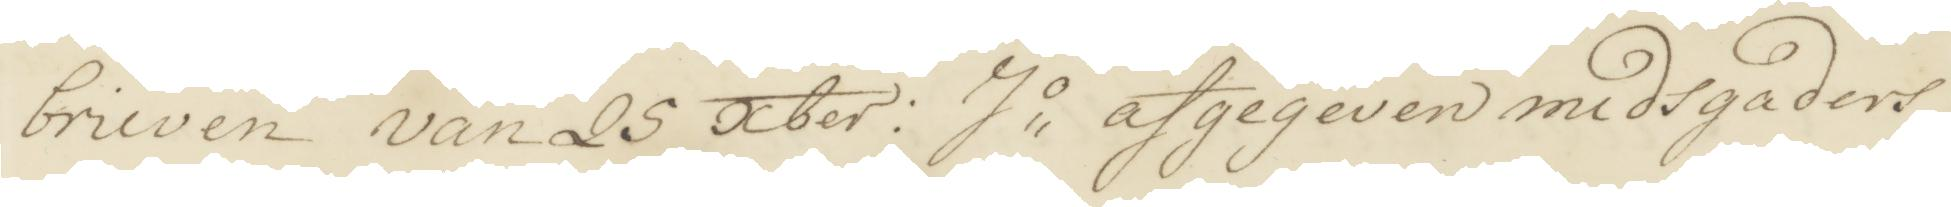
brieven van 25 xber: J„o afgegeven midsgaders
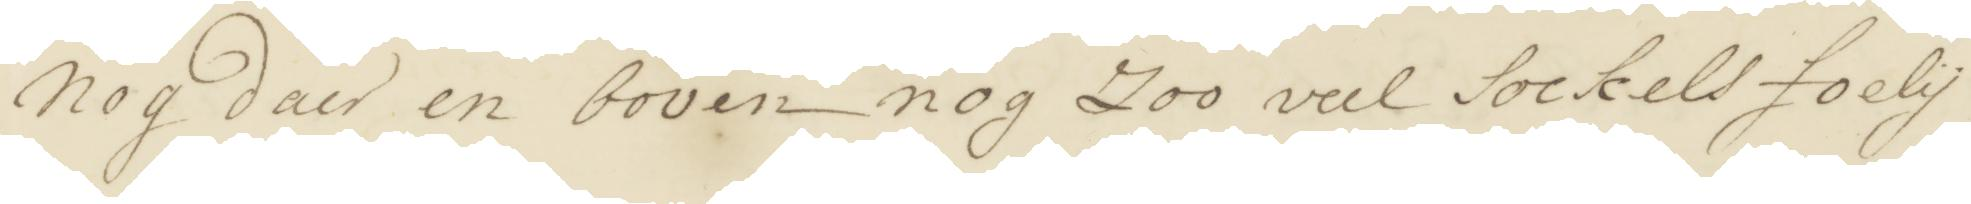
nog daer en boven nog zoo veel sockels foelij
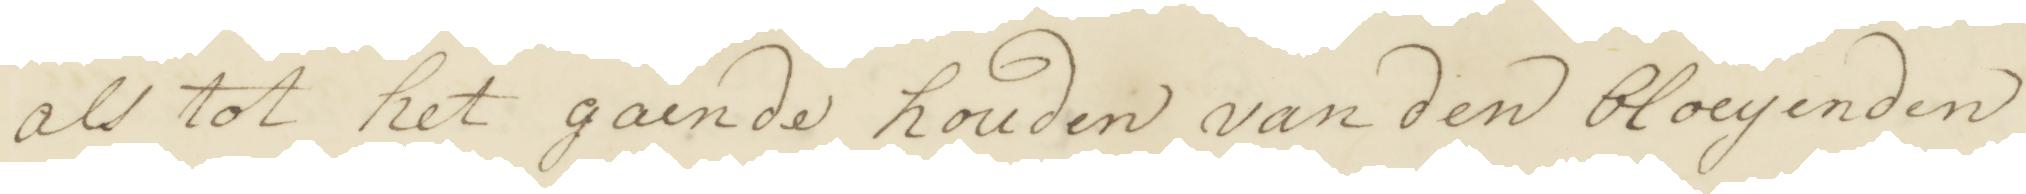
als tot het gaende houden van den bloeyenden
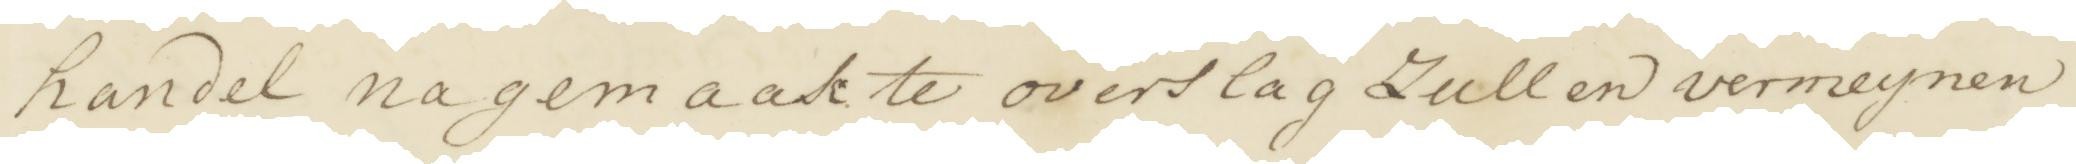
handel na gemaakte overslag zullen vermeynen
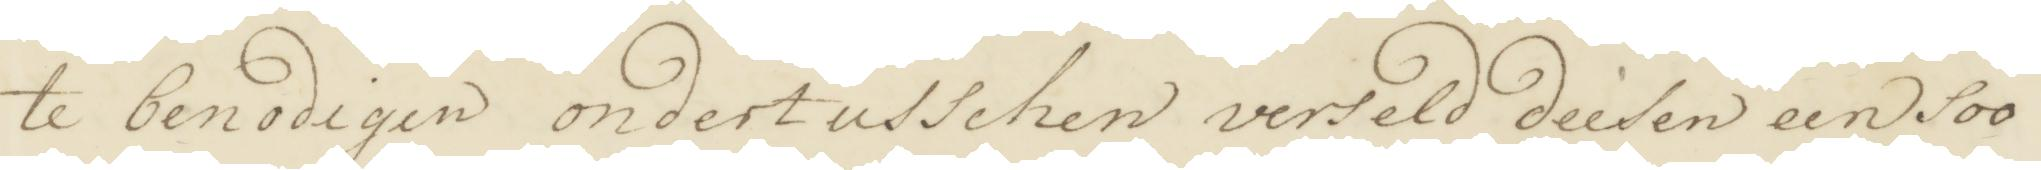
te benodigen ondertusschen verseld deesen een soo
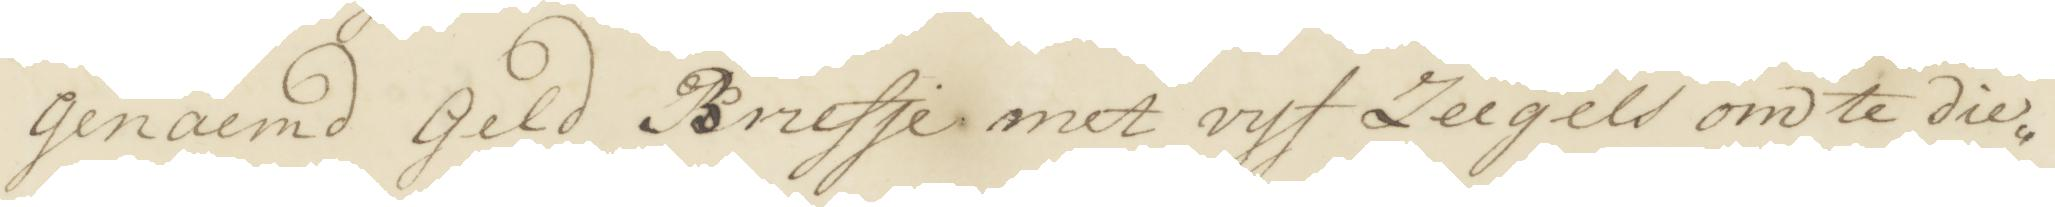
genaemd geld Briefje met vyf zeegels om te die„
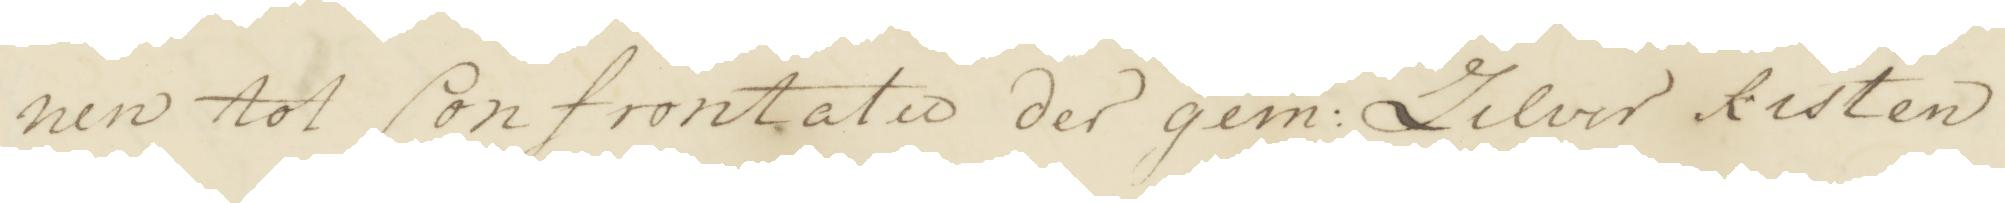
nen tot Confrontatie der gem: zilver kisten
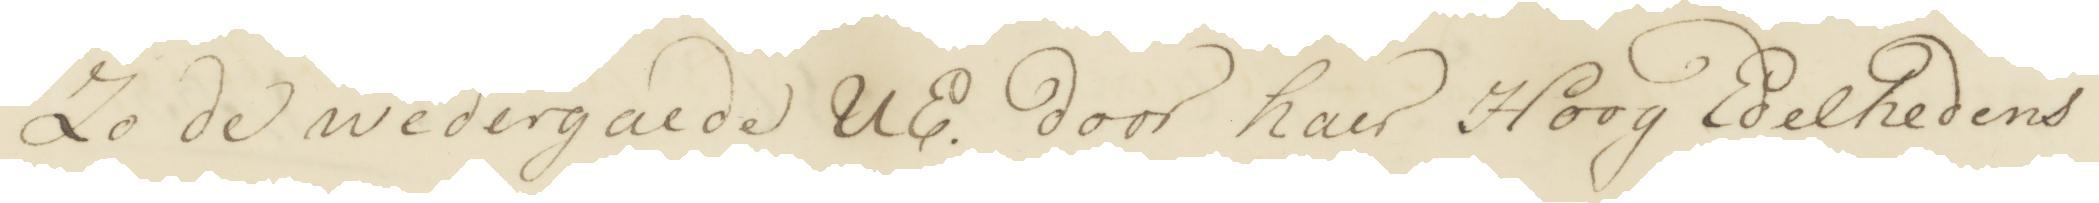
zo de wedergaede UE. door haer Hoog Edelhedens
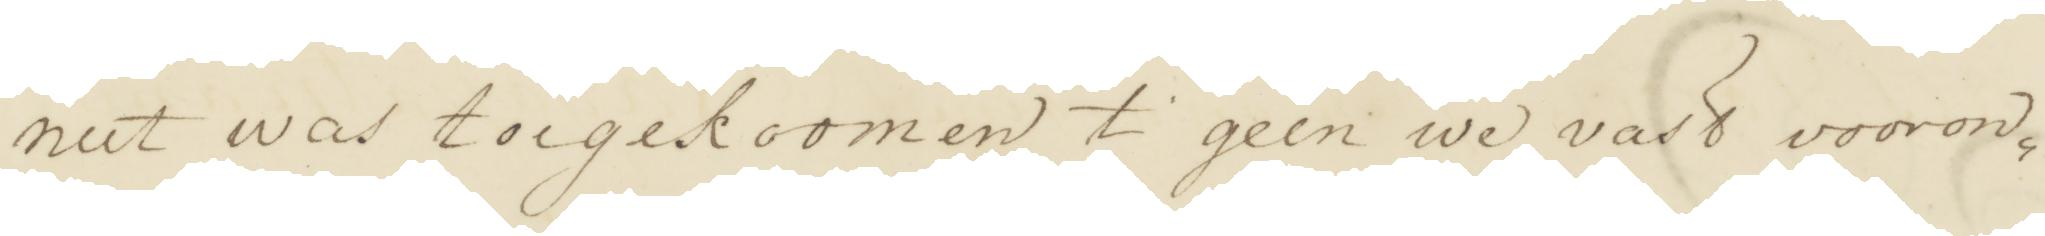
niet was toegekoomen t' geen we vast vooron„
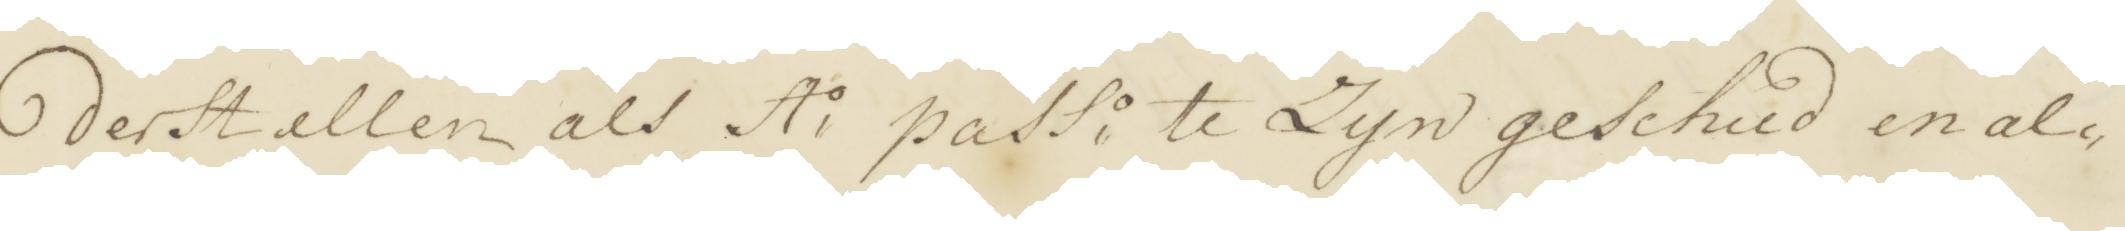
derstellen als A:o pass„o te zyn geschied en al„
